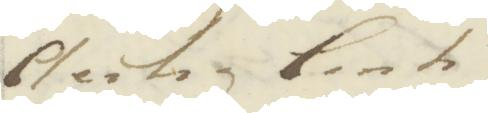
dertig Cent
